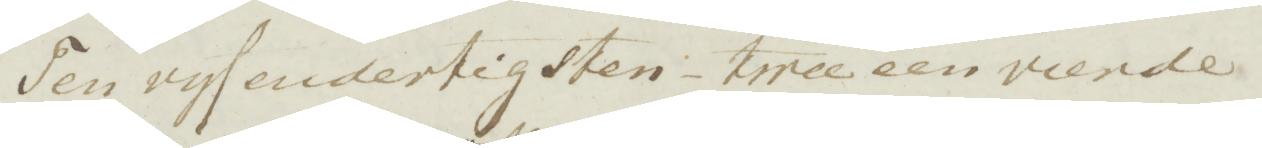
Ten vyf endertigsten - twee een vierde
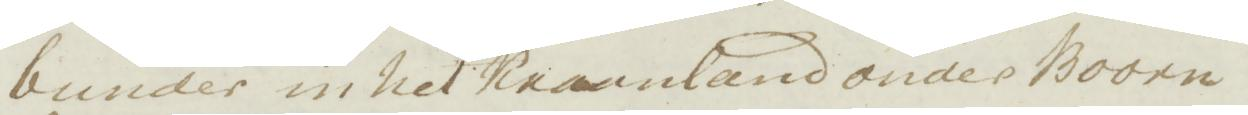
bunder in het kraanland onder Boorn
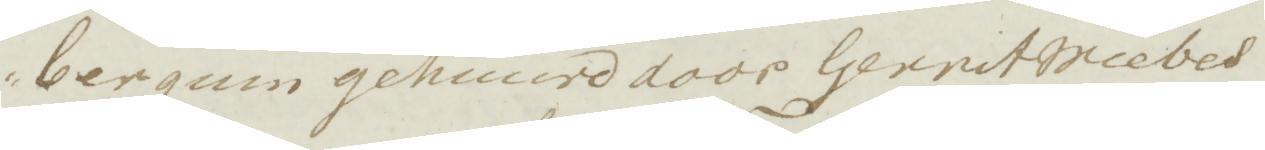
„bergum gehuurd door Gerrit Wiebes
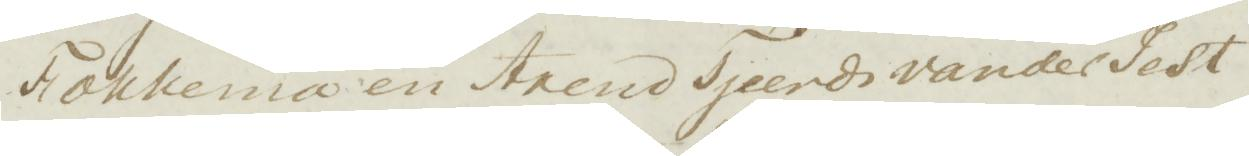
Fokkema en Arend Tjeerds van der Lest
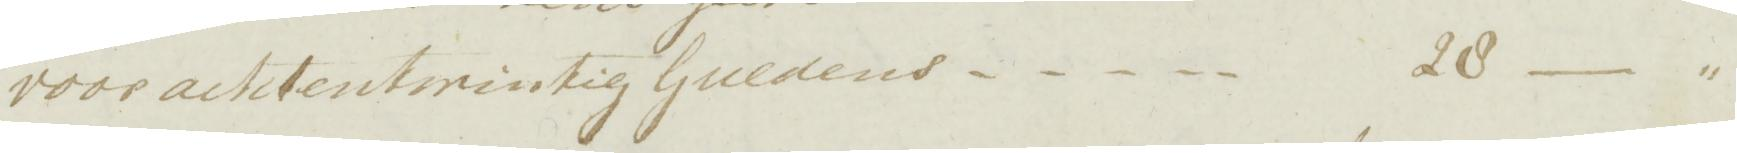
voor achtentwintig Guldens - - - - - 28 — „
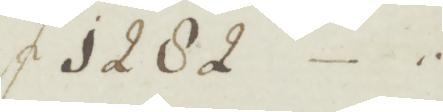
ƒ 1282 — „
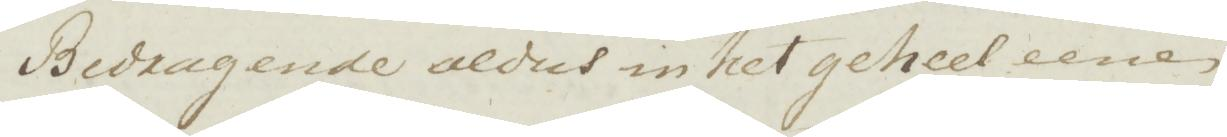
Bedragende aldus in het geheel eene
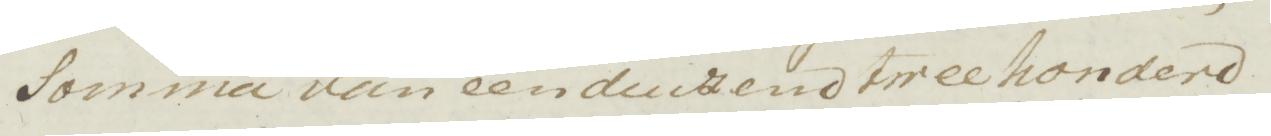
somma van een duizend twee honderd
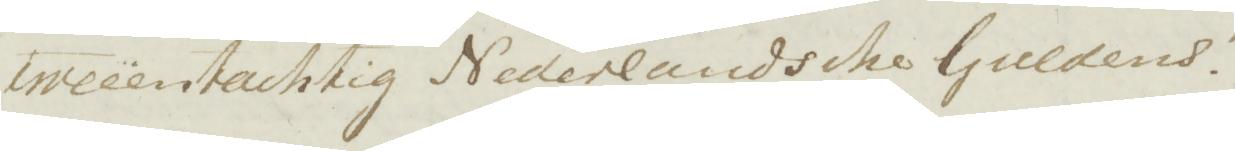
tweeën tachtig Nederlandsche Guldens.
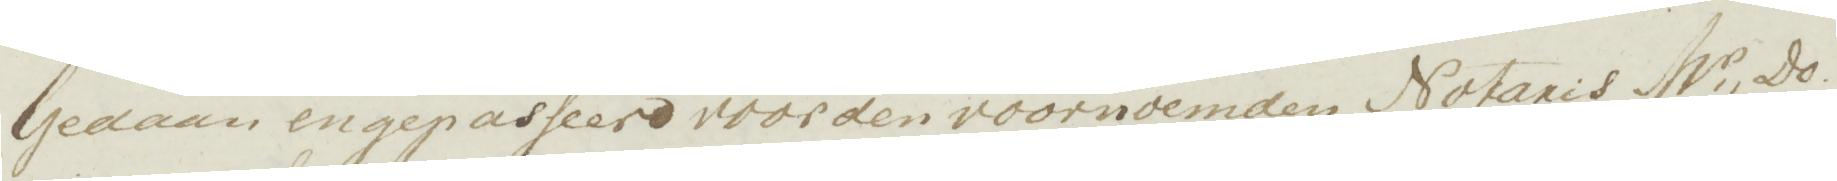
Gedaan en gepasseerd voor den voornoemden Notaris M„r Do„
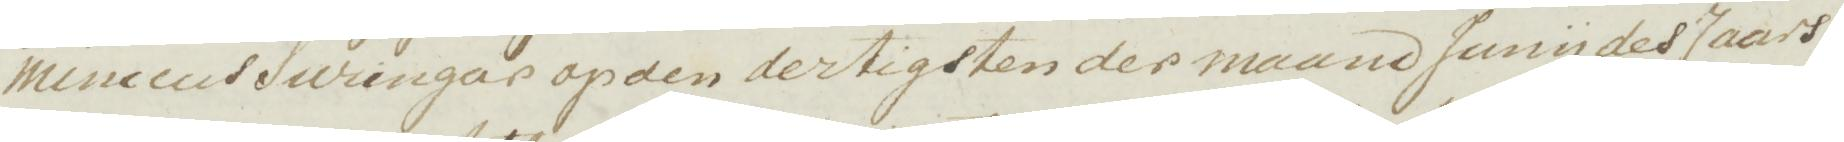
minicus Suringar op den dertigsten der maand Junij des Jaars
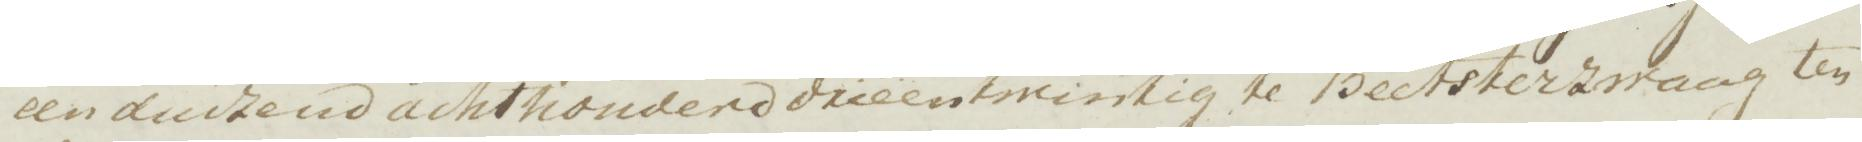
een duizend achthonderd drieën twintig te Beetsterzwaag ten
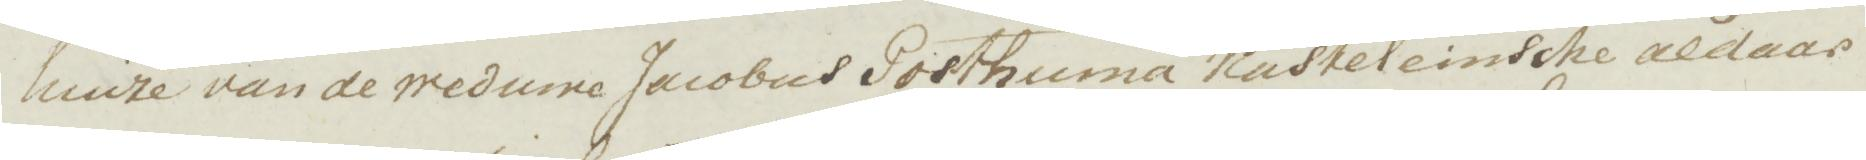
huize van de weduwe Jacobus Posthuma Kasteleinsche aldaar
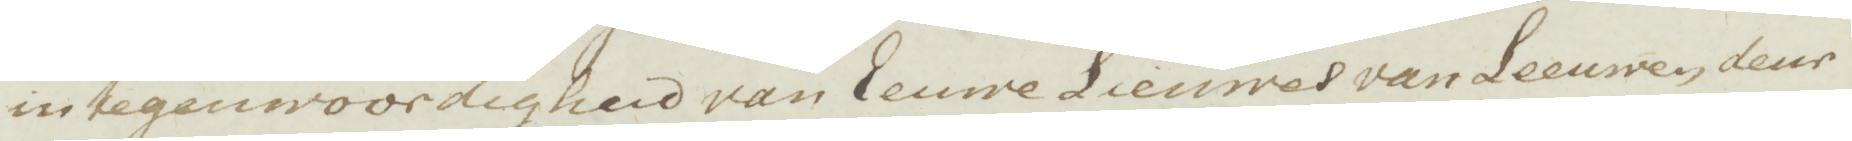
in tegenwoordigheid van Eeuwe Lieuwes van Leeuwen deur
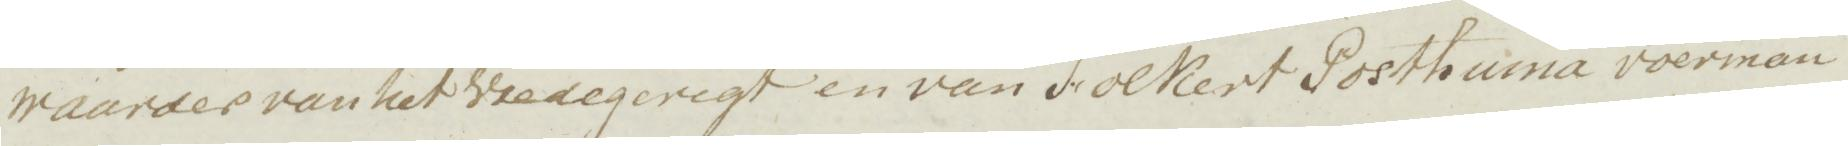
waarder van het Vredegeregt en van Folkert Posthuma voerman
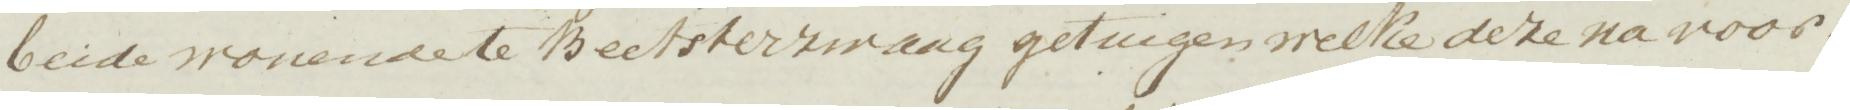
beide wonende te Beetsterzwaag getuigen welke deze na voor.
